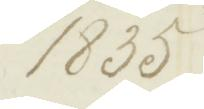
1835
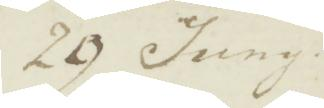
29 Iuny.
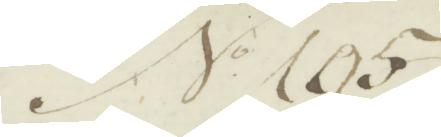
N:o 195
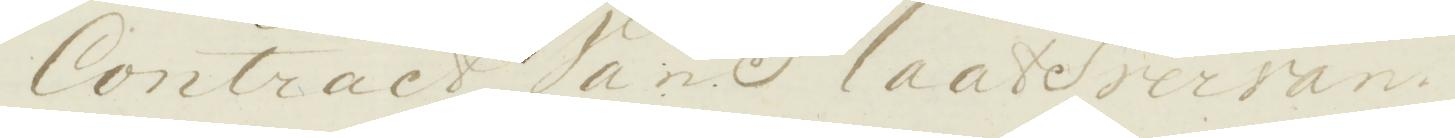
Contract Van Plaatsvervan„
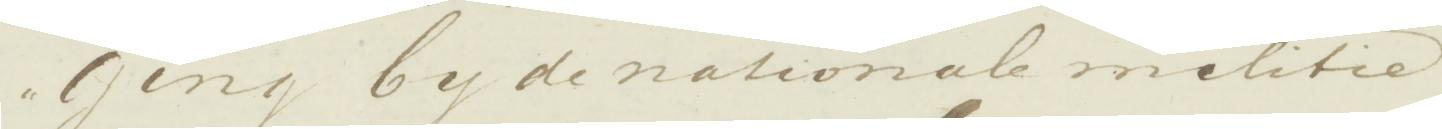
„ging by de nationale militie
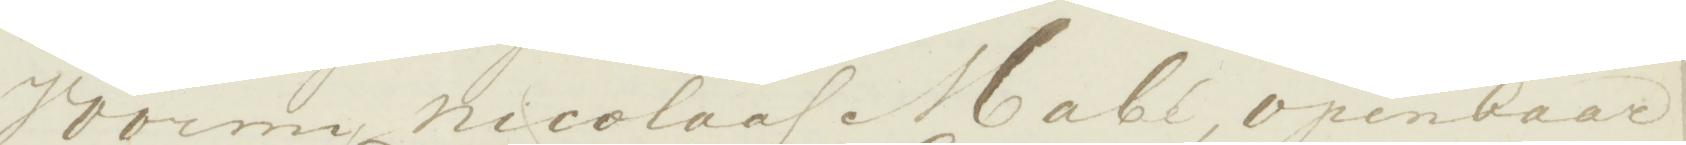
Voor my Nicolaas Mabé openbaar
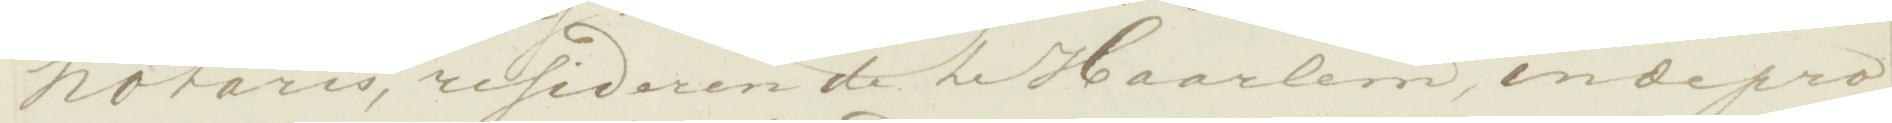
notaris, residerende te Haarlem, in de pro
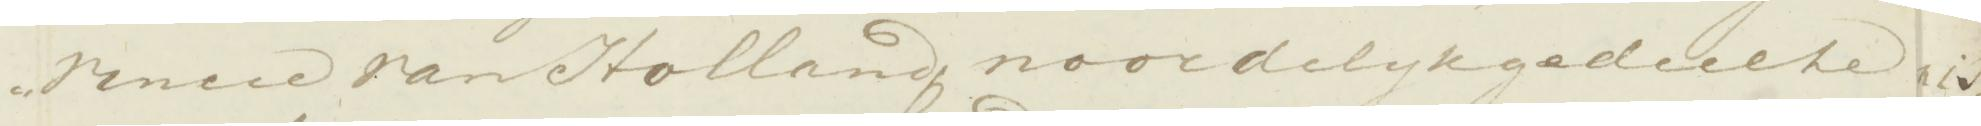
„vincie van Holland, noordelyk gedeelte
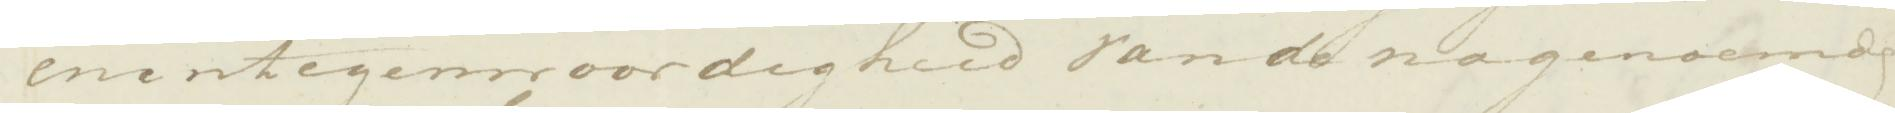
en integenwoordigheid van de nagenoemde
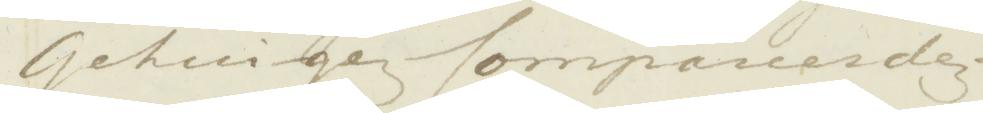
Getuigen Compareerden
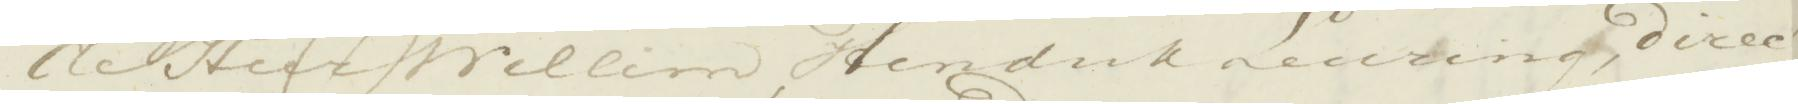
de Heer Willem Hendrik Leering, direc
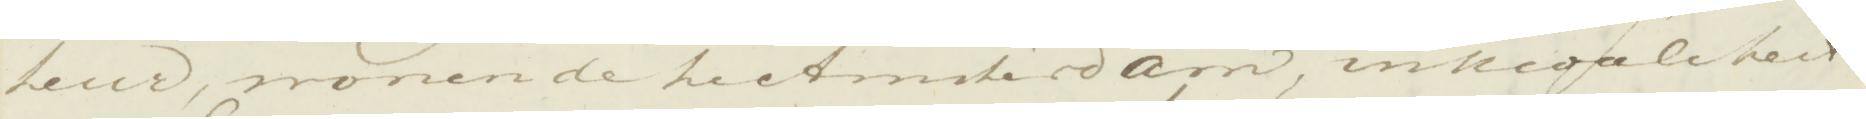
teur, wonende te Amsterdam, in kwaliteit
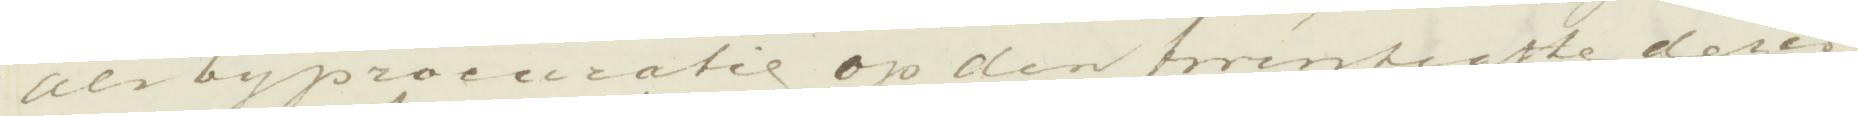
als by procuratie op den twintigste dezer
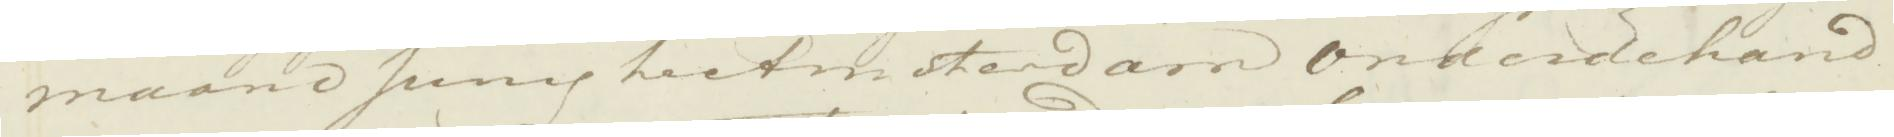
maand Juny te Amsterdam onder de hand
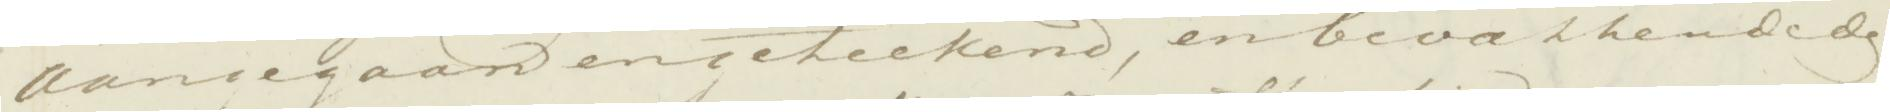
aangegaan en geteekend, en bevattende de
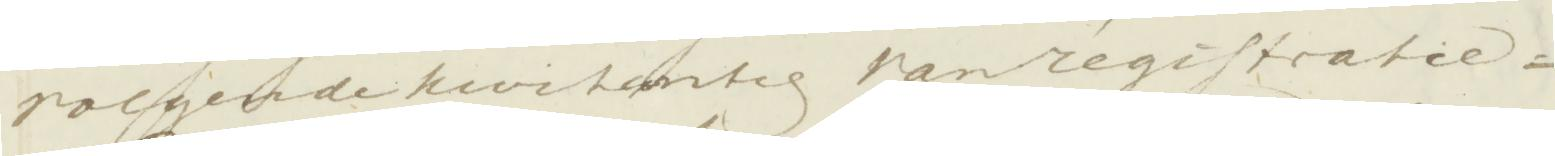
volgende kwitantie van registratie=
